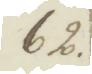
62.
